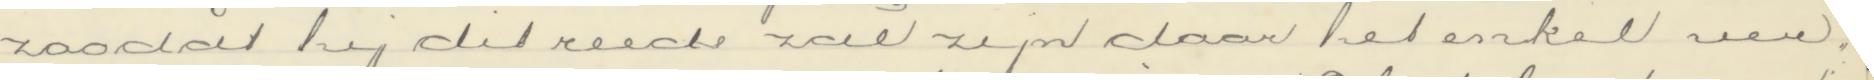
zoodat hij dit reeds zal zijn door het enkel ver„
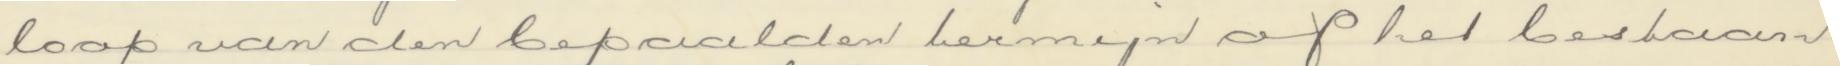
loop van den bepaalden termijn of het bestaan
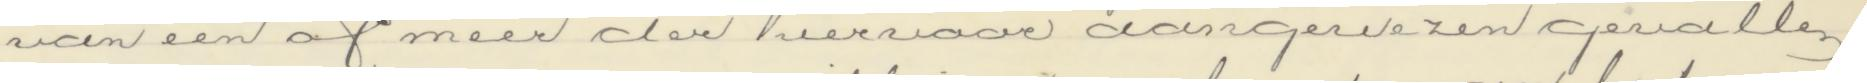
van een of meer der hiervoor aangewezen gevallen
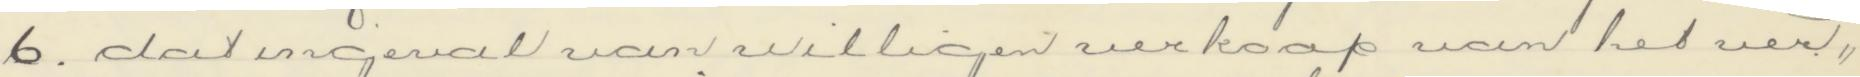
6. dat ingeval van willigen verkoop van het ver„
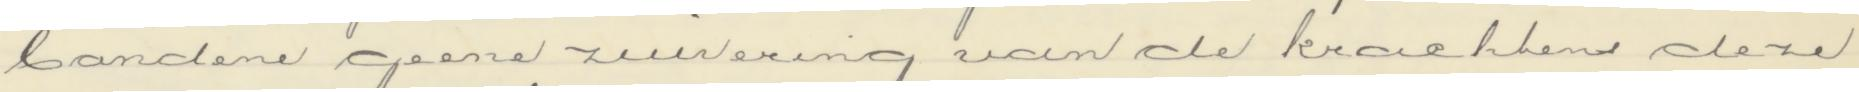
bondene geene zuivering van de krachtens deze
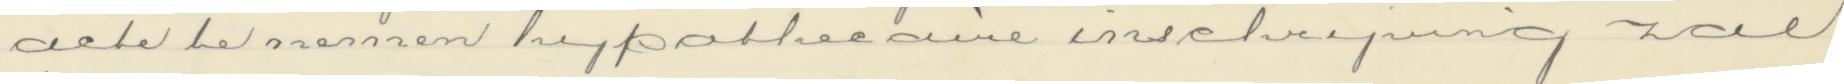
acte te nemen hypothecaire inschrijving zal
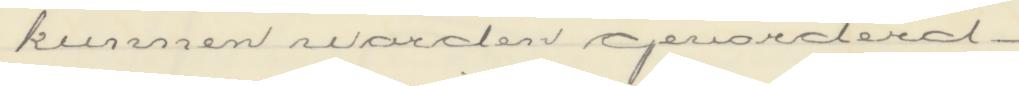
kunnen worden gevorderd
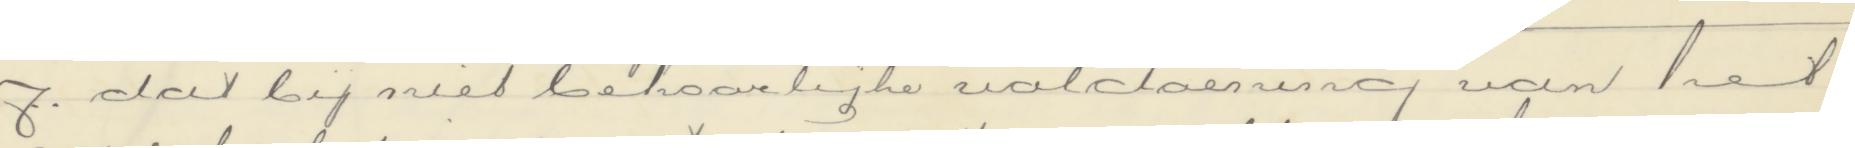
7. dat bij niet behoorlijke voldoening van het
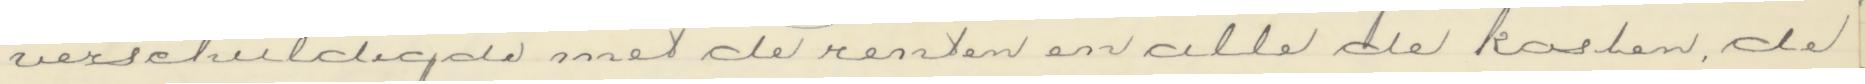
verschuldigde met de renten en alle kosten, de
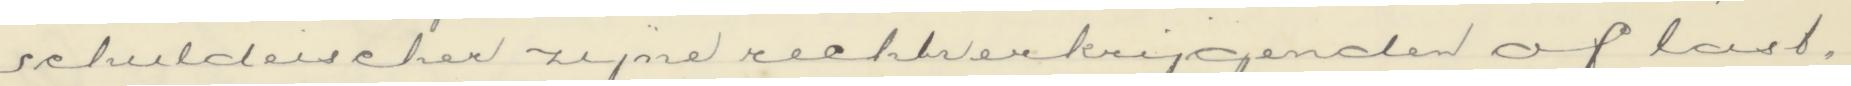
schuldeischer zijne rechtverkrijgenden of last„
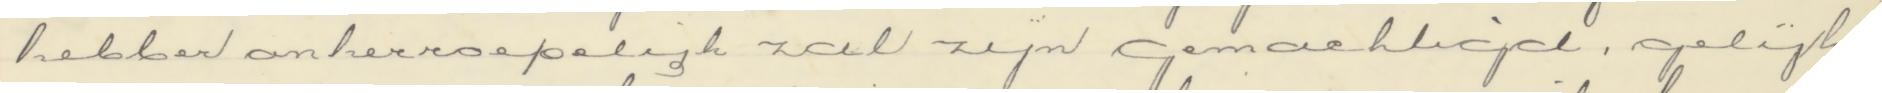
hebber onherroepelijk zal zijn gemachtigd, gelijk
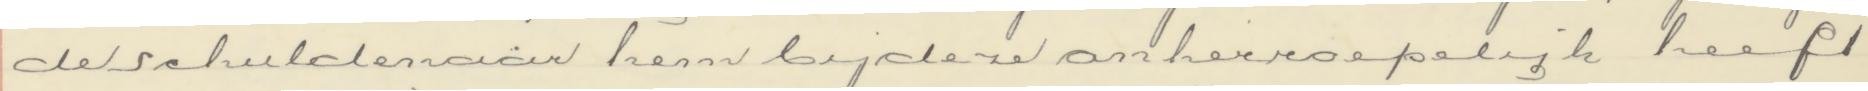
de schuldenaar hem bij deze onherroepelijk heeft
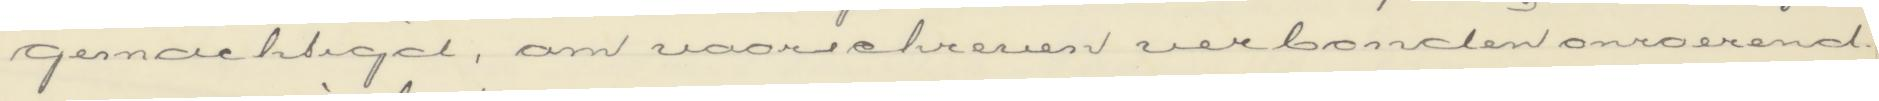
gemachtigd, om voorschreven verbonden onroerend
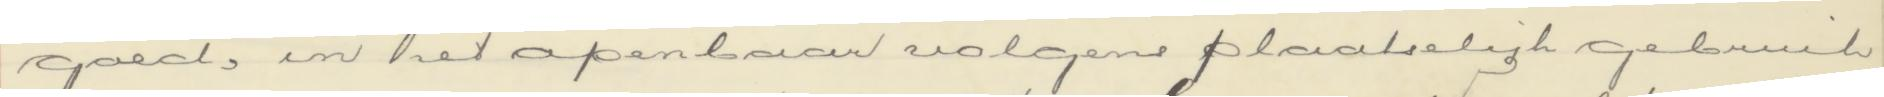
goed in het openbaar volgens plaatselijk gebruik
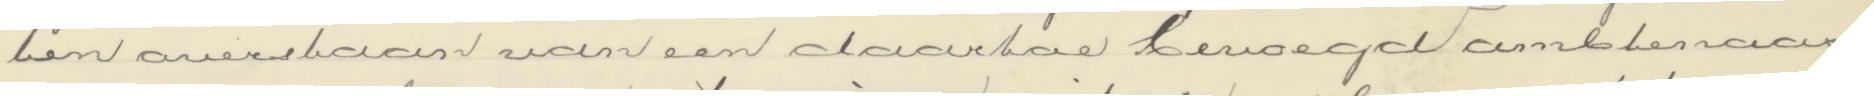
ten overstaan van een daartoe bevoegd ambtenaar
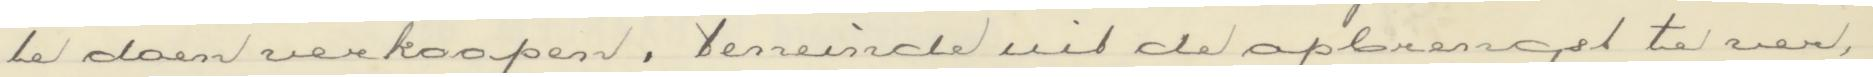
te doen verkoopen, teneinde uit de opbrengst te ver,
